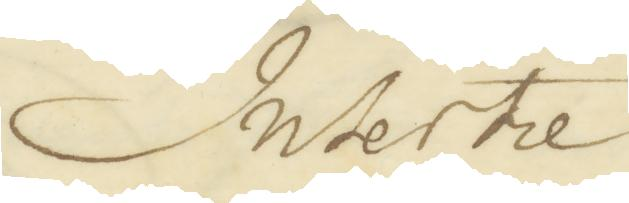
Insertie
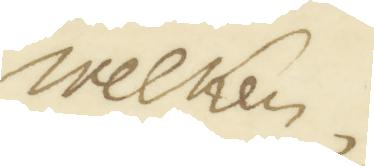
welken,
